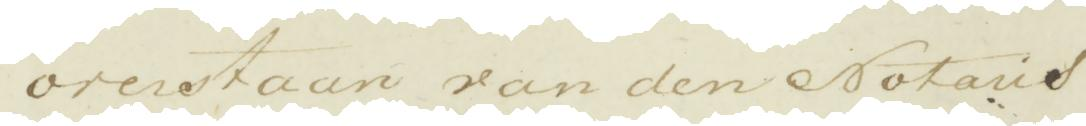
overstaan van den Notaris
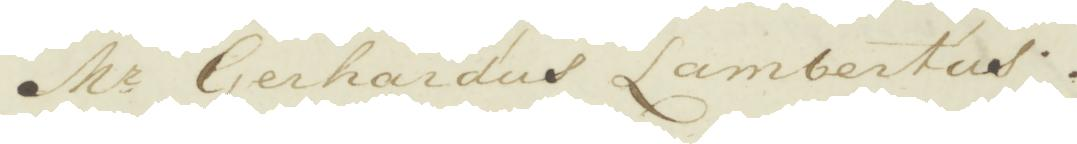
M-r Gerhardus Lambertus.
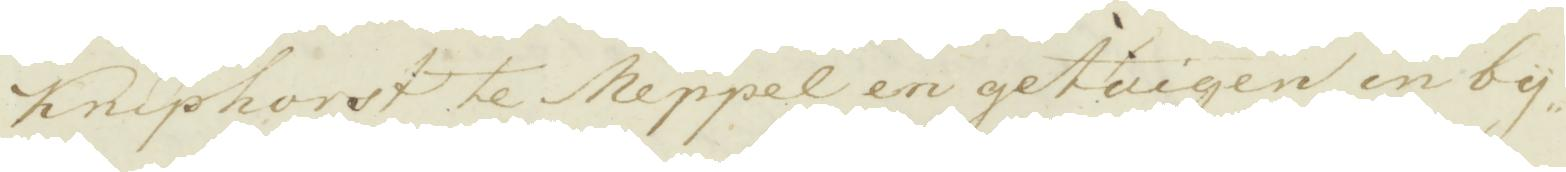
Kniphorst te Meppel en getuigen in bij
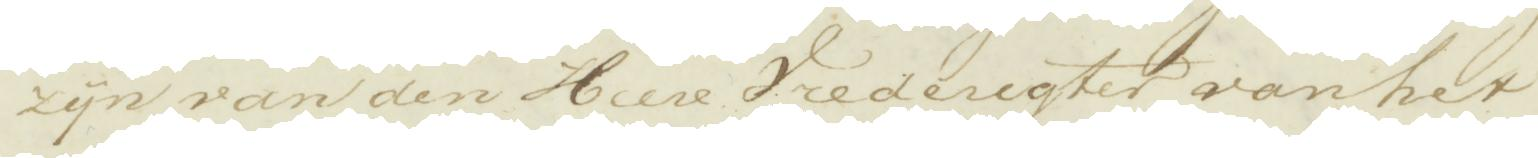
zijn van den Heere Vrederegter van het
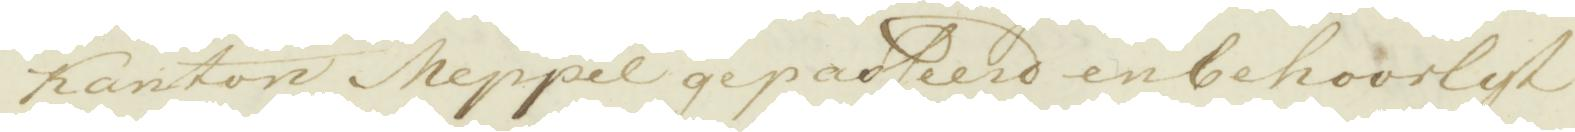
kanton Meppel gepasseerd en behoorlyk
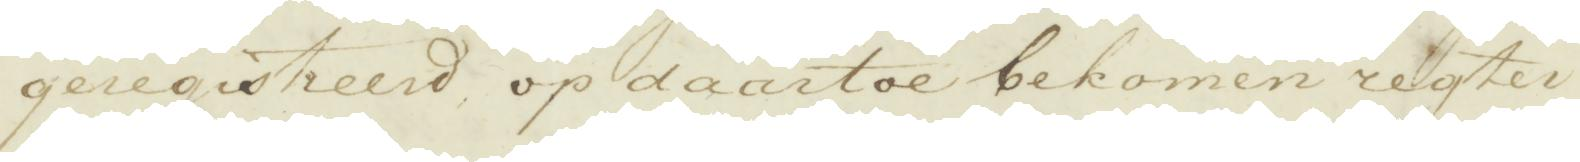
geregistreerd, op daartoe bekomen regter
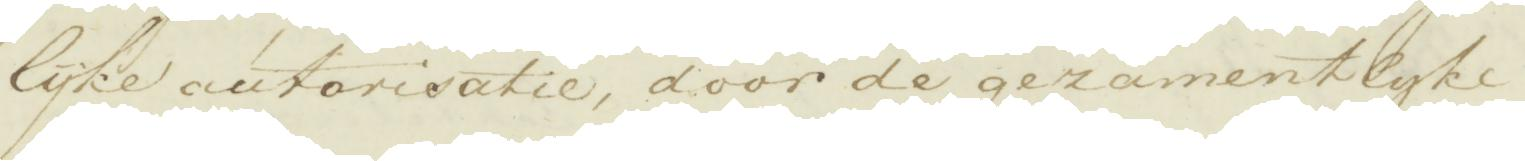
lijke autorisatie, door de gezamentlyke
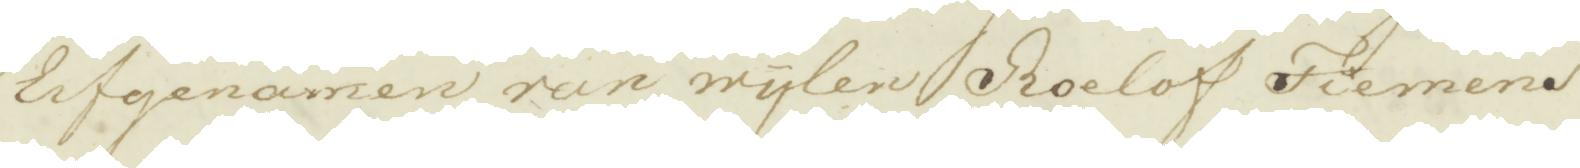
Erfgenamen van wijlen Roelof Tiemens
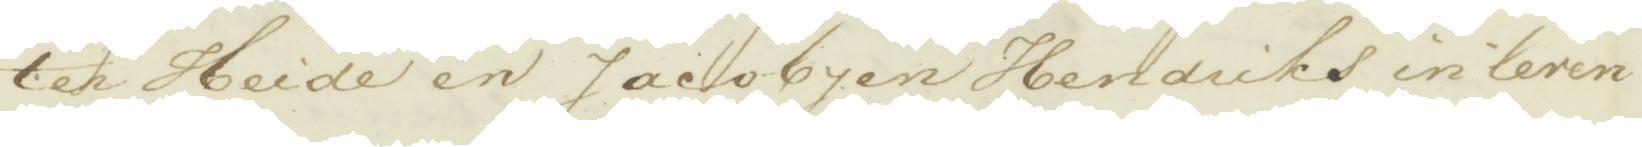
ter Heide en Jacobjen Hendriks in leven
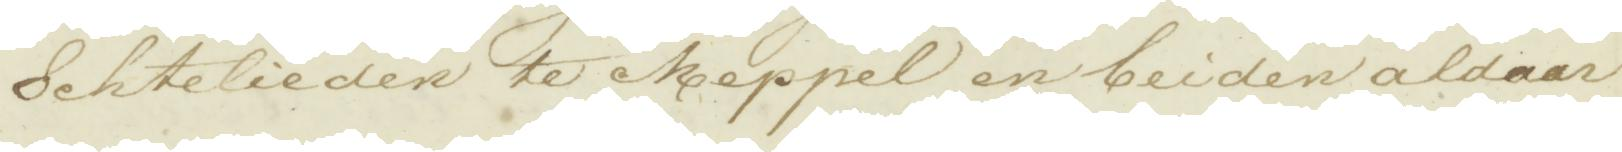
Echtelieden te Meppel en beiden aldaar
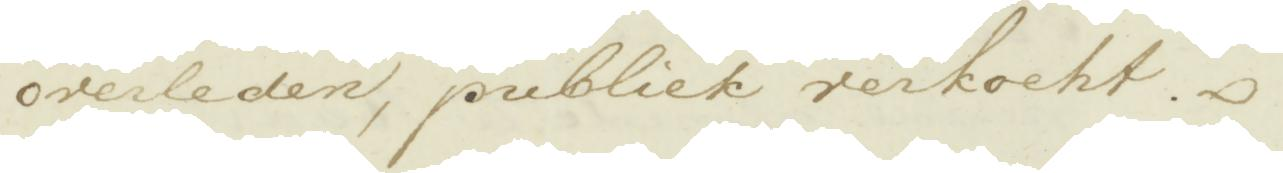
overleden, publiek verkocht.—
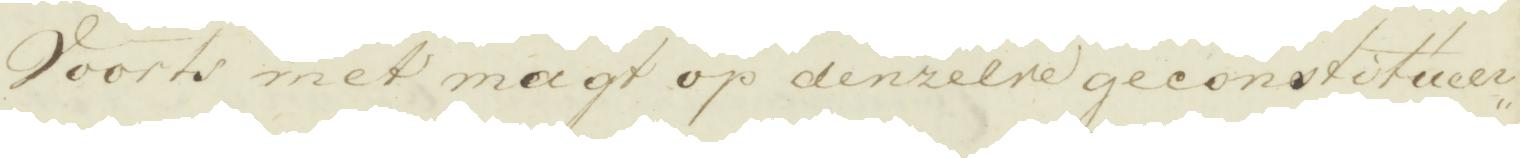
Voorts met magt op denzelve geconstitueer„
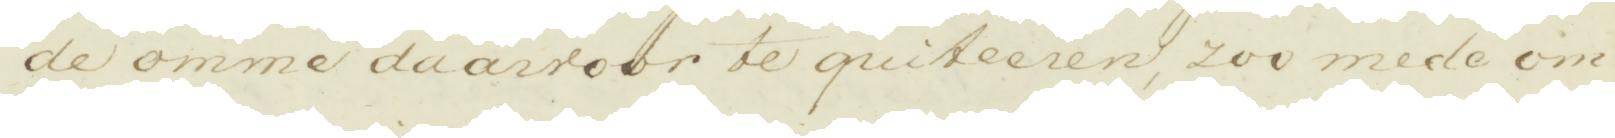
de omme daarvoor te quiteeren, zoo mede om
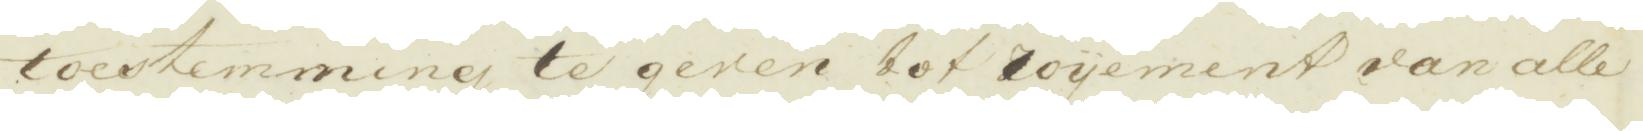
toestemming te geven tot roijement van alle
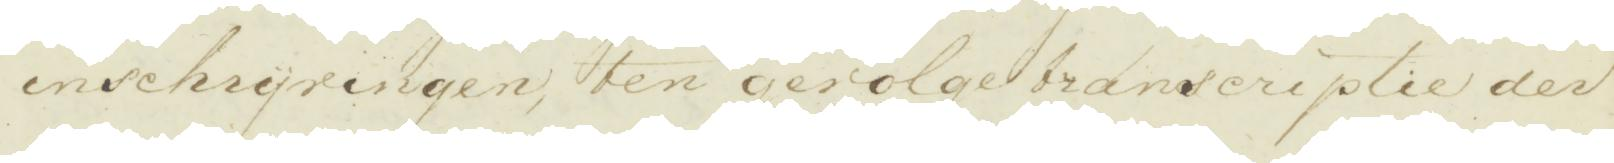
inschrijvingen, ten gevolge transcriptie der
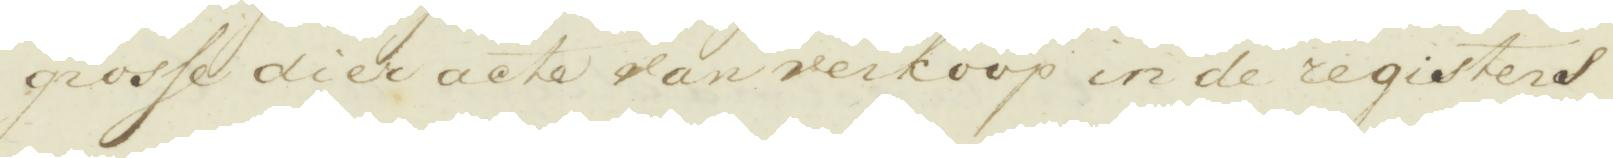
grosse dier acte van verkoop in de registers
